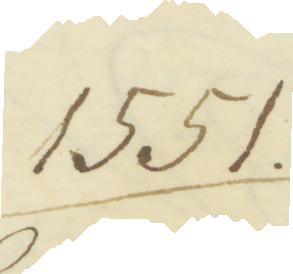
1551.
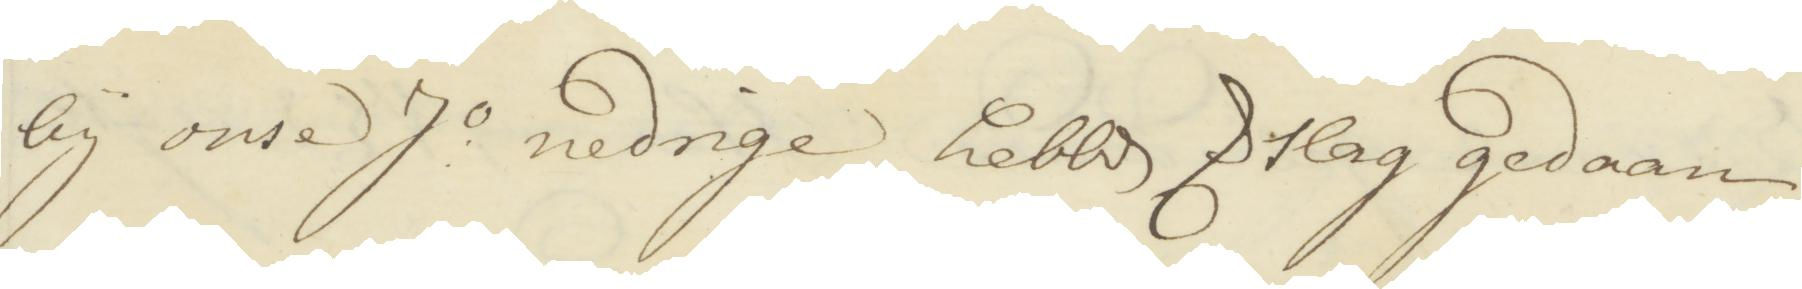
bij onse J:o nedrige hebben verslag gedaan
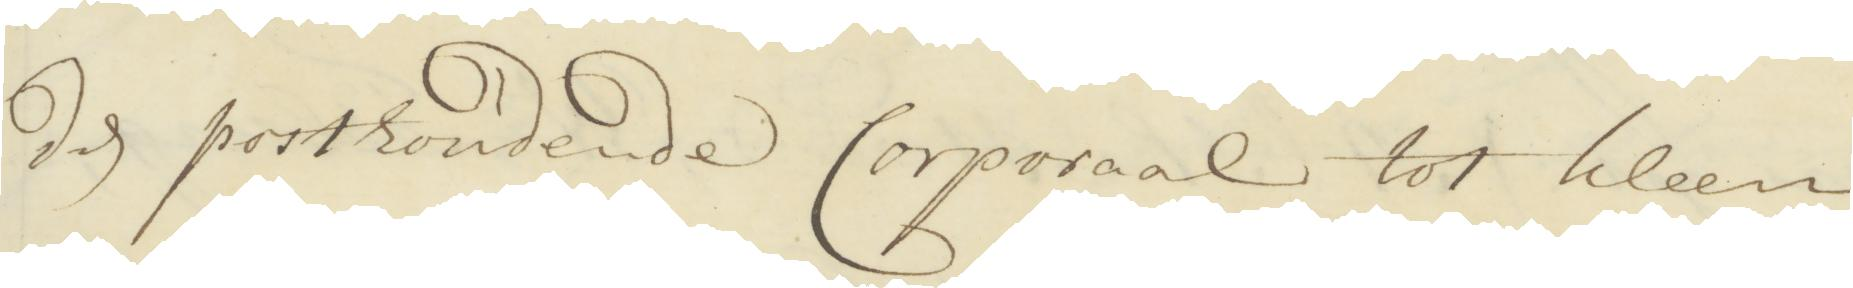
den posthoudende Corporaal tot kleen
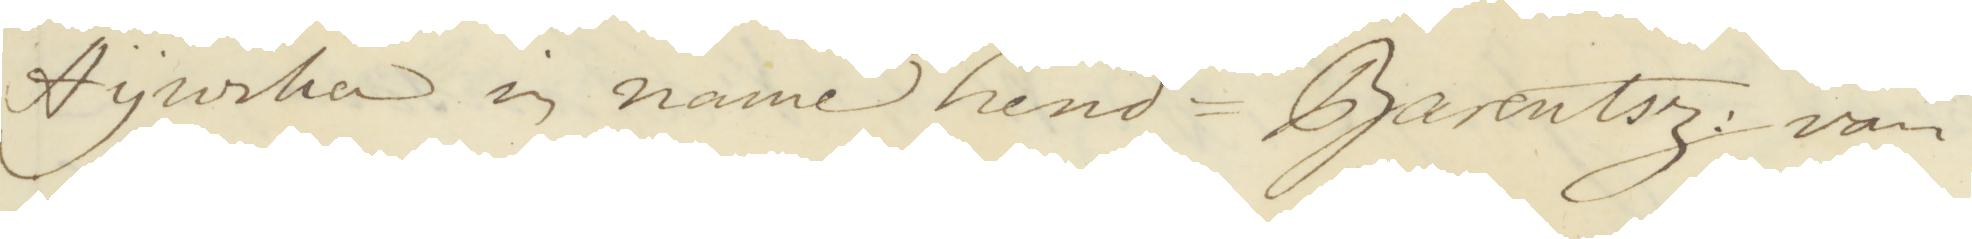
Aijwika in name hend=k Barentsz: van
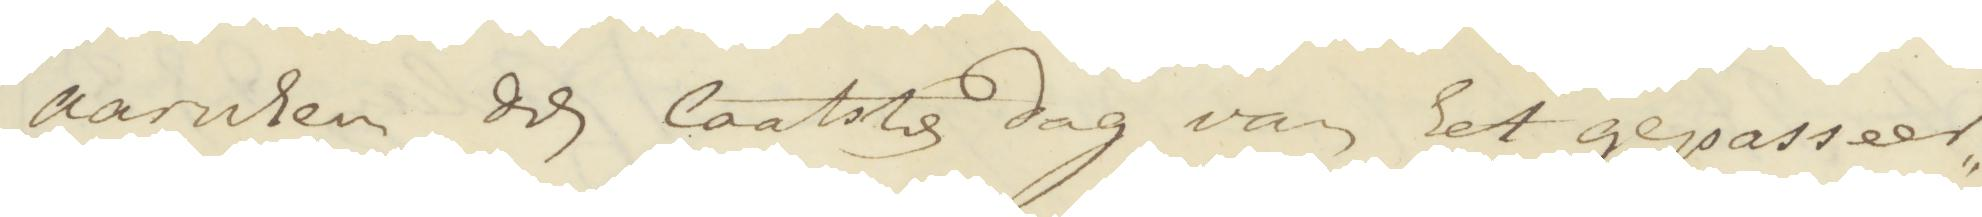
aarnhem den laatsten dag van het gepasseer„
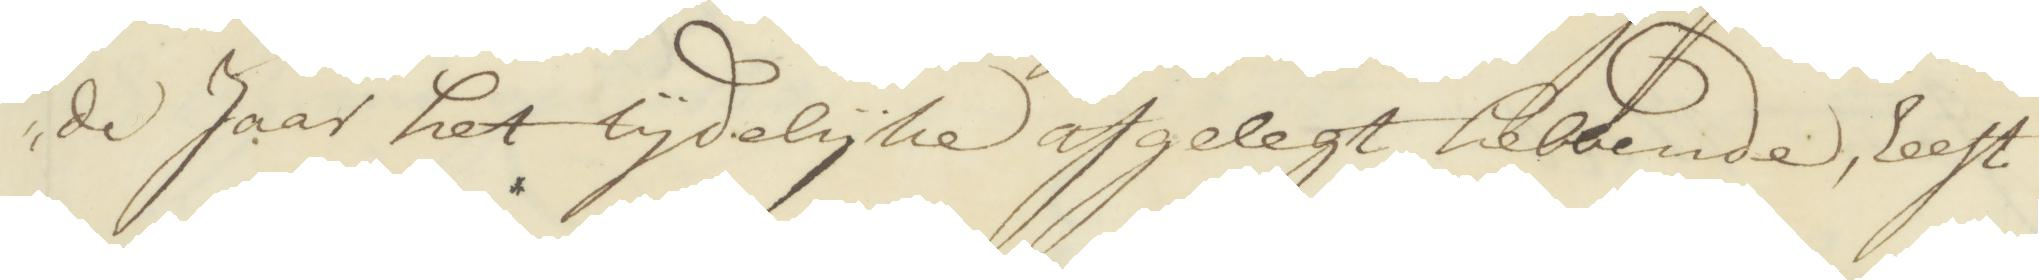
„de Jaar het tijdelijke afgelegt hebbende, heeft
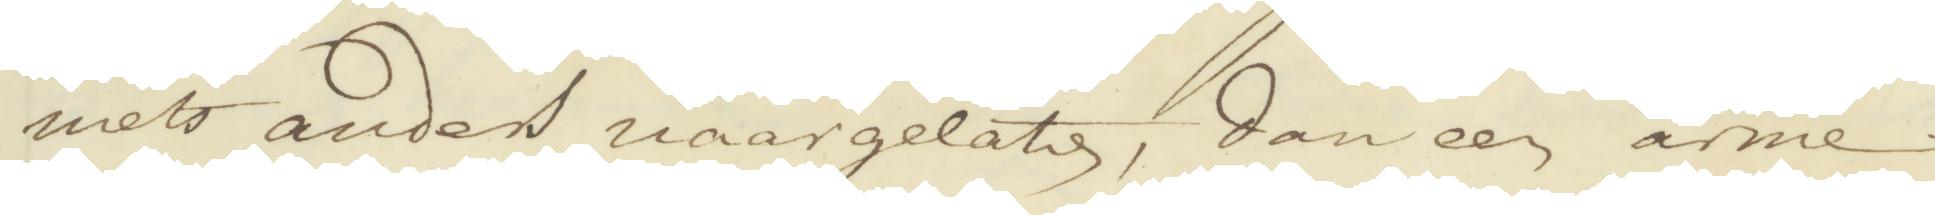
niets anders naargelaten, dan een arme
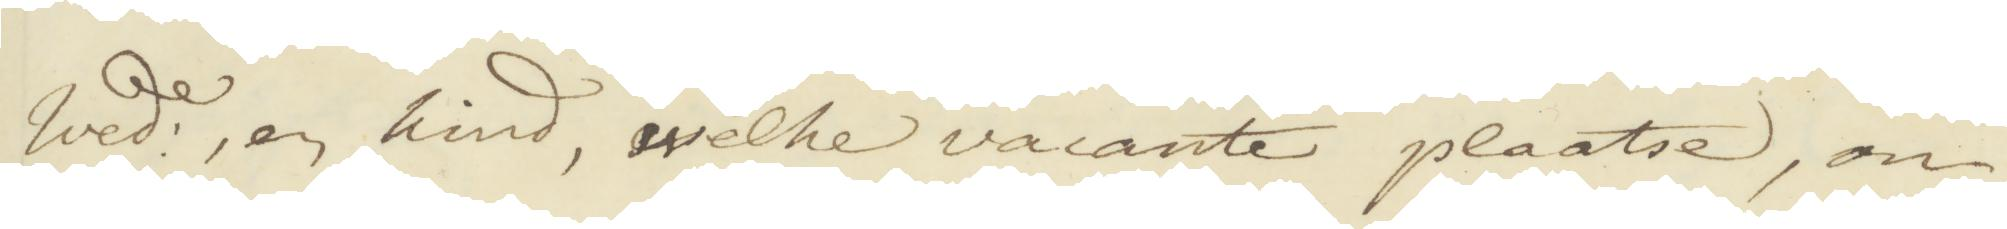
wed:e, en kind, welke vacante plaatse, on
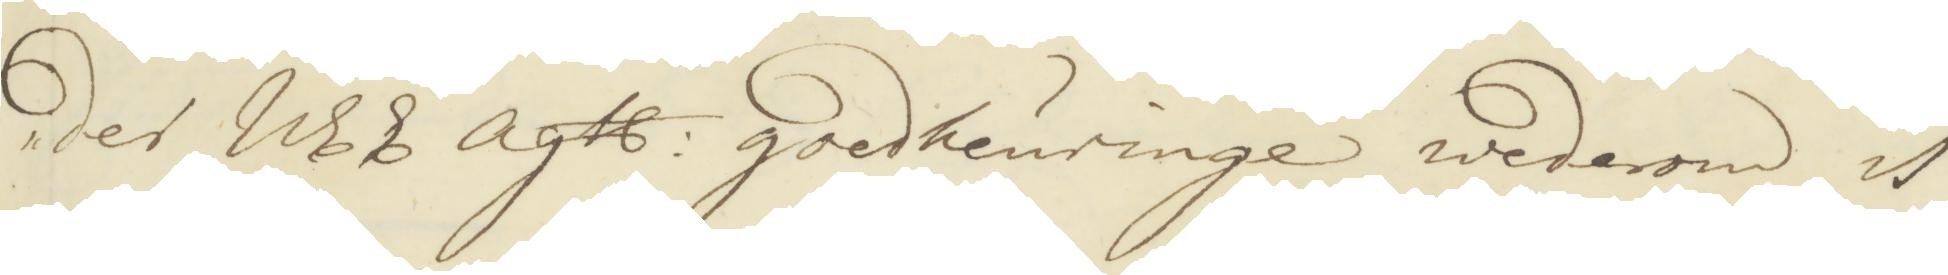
„der UEE agtb: goedkeuringe wederom is
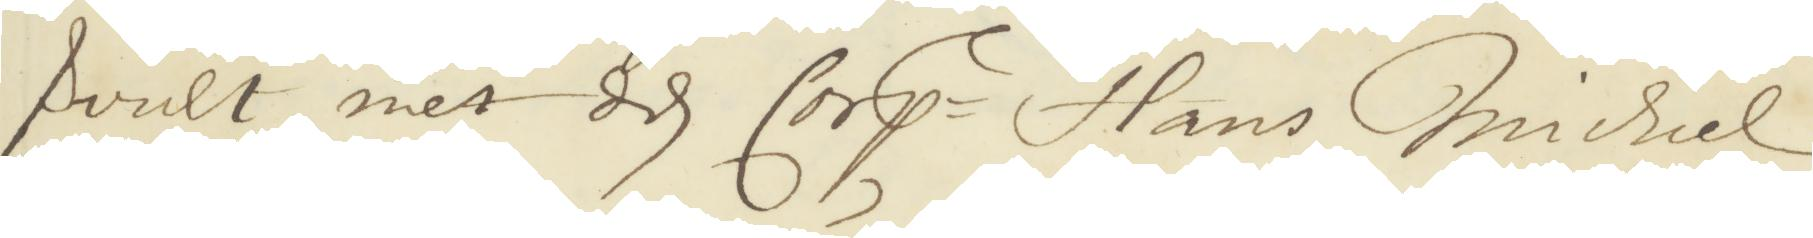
vervult met den Corp=l Hans Michiel
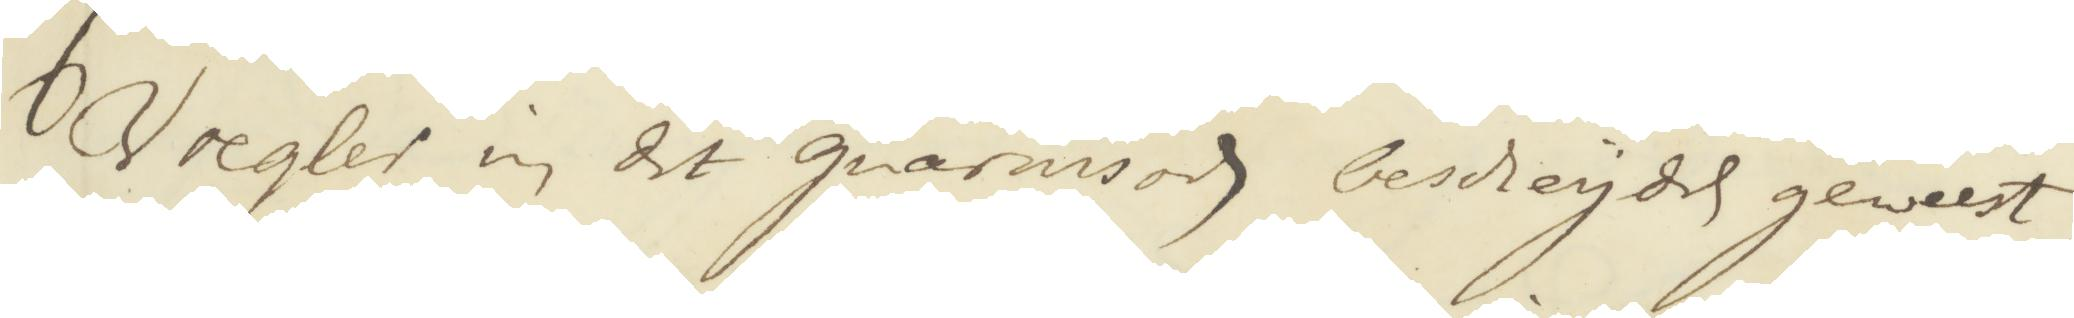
Voegler in dit guarnisoen bescheijden geweest
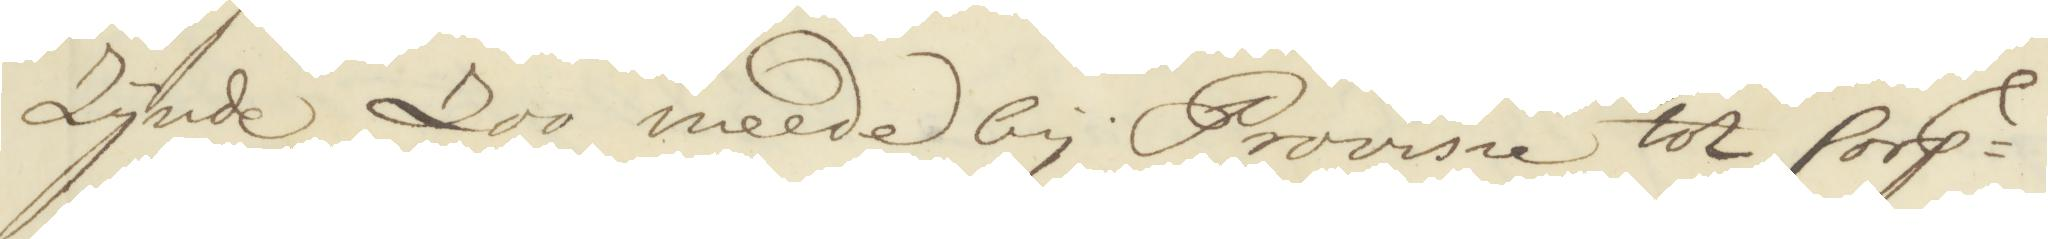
zijnde zoo meede bij Provisie tot Corp=l
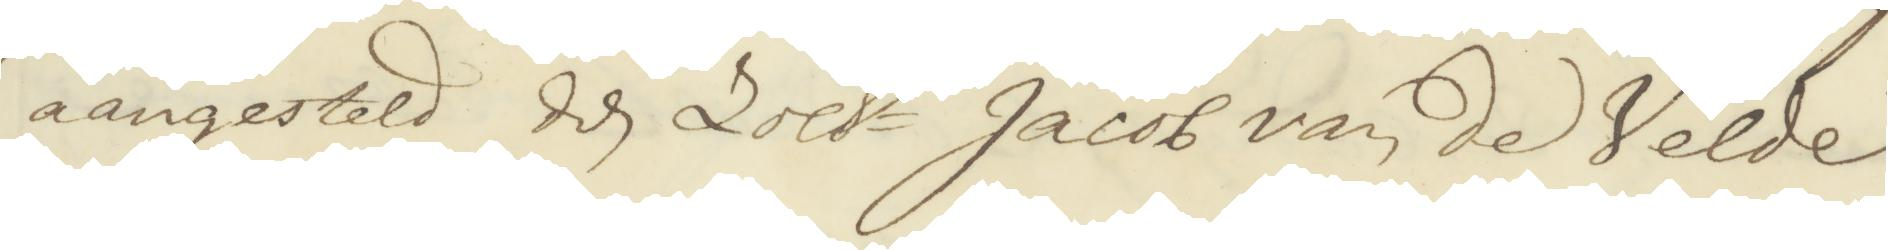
aangesteld den Zold=t Jacob van de Velde
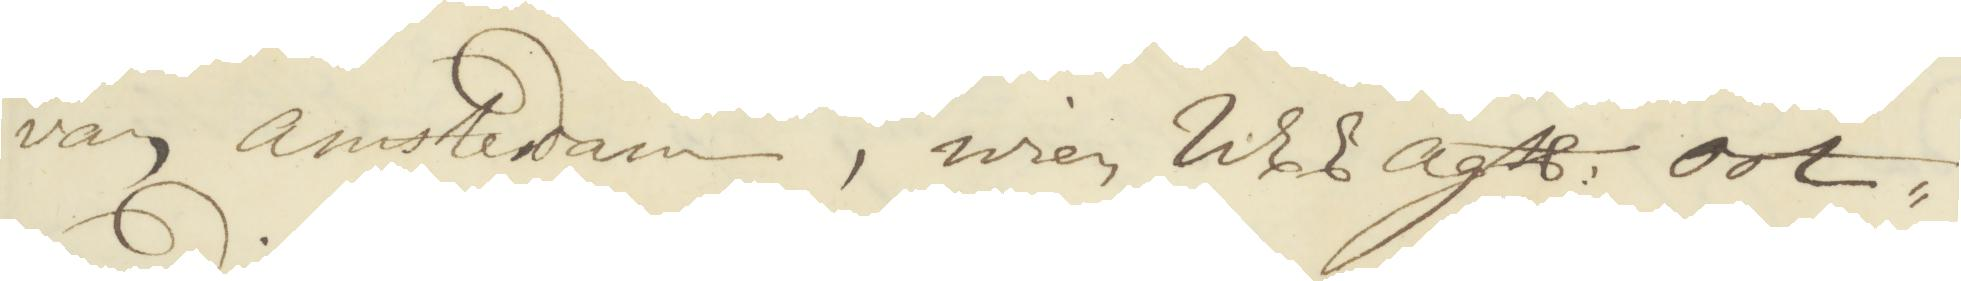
van Amsterdam, wien UEE agtb: oot„
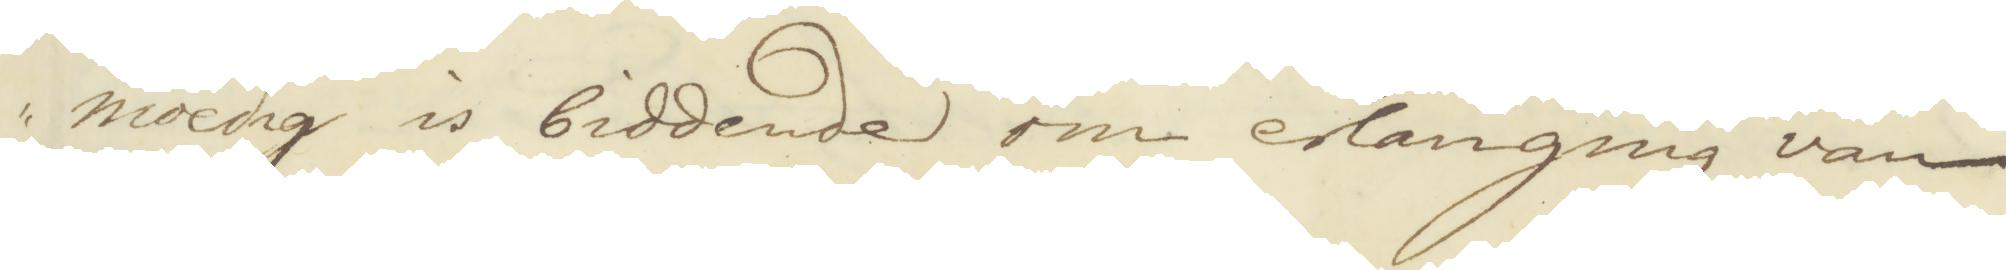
„moedig is biddende om erlanging van
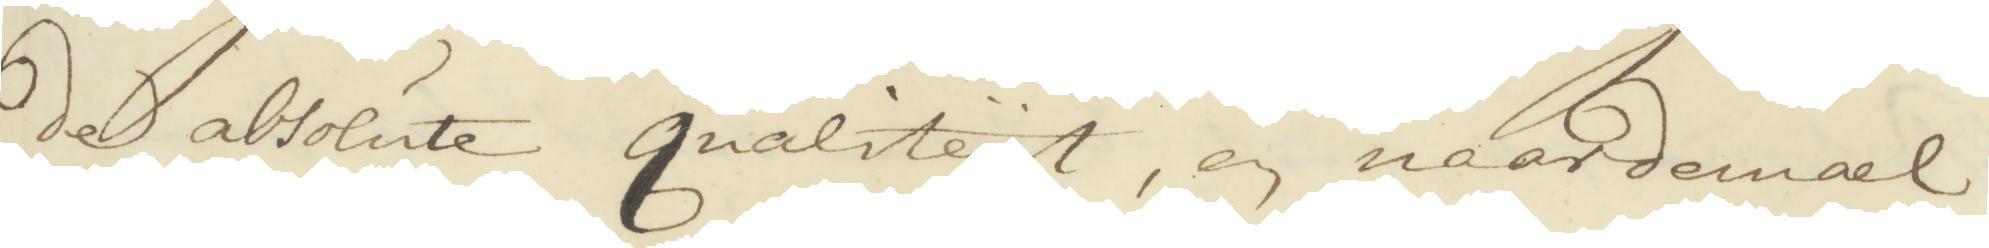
de absolute qualiteit, en naardemael
